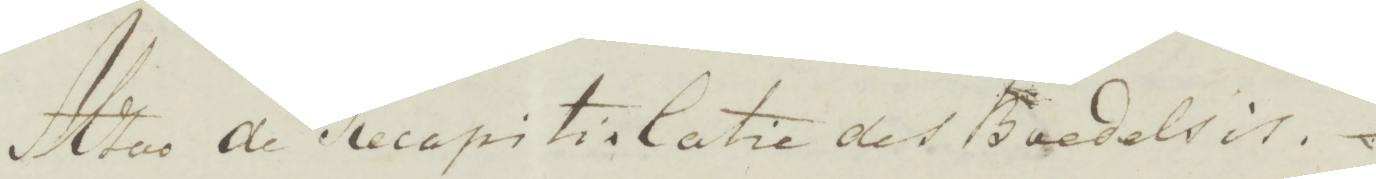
Alzoo de Recapitulatie des Boedels.—
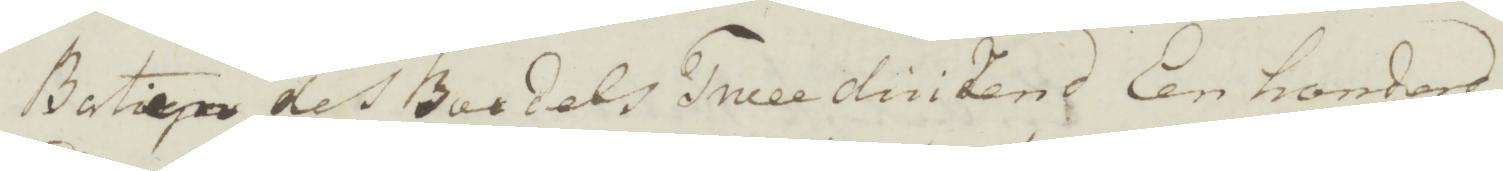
Baten des Boedels Twee duizend, Een honderd
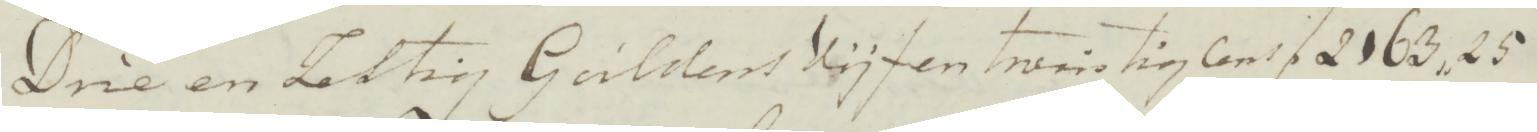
Drie en Zestig Guldens Vijf en twintig Cent ƒ 2163„25
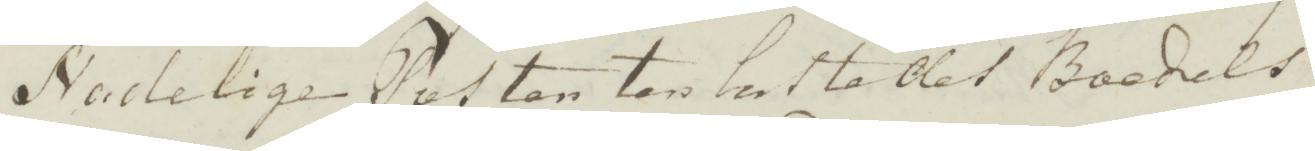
Nadelige Posten ten laste des Boedels
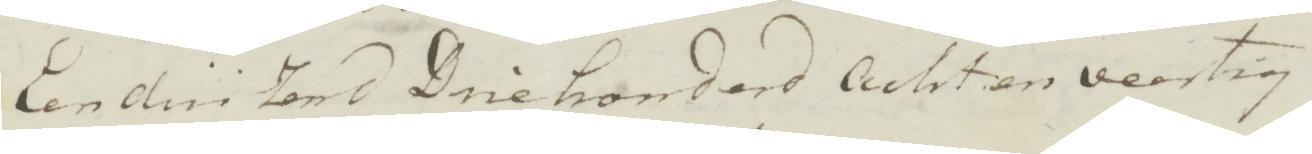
Een duizend Drie honderd Acht en veertig
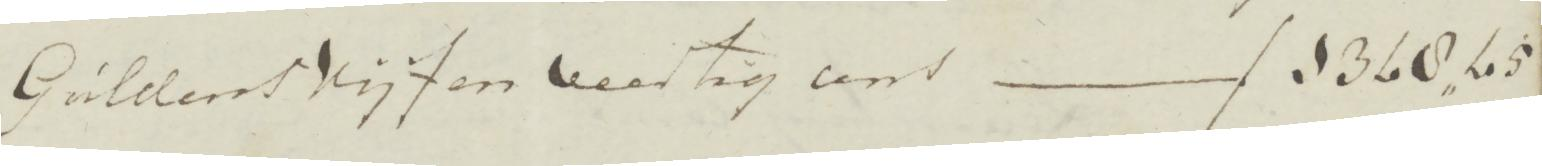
Guldens Vijf en veertig cent — ƒ 1348„45
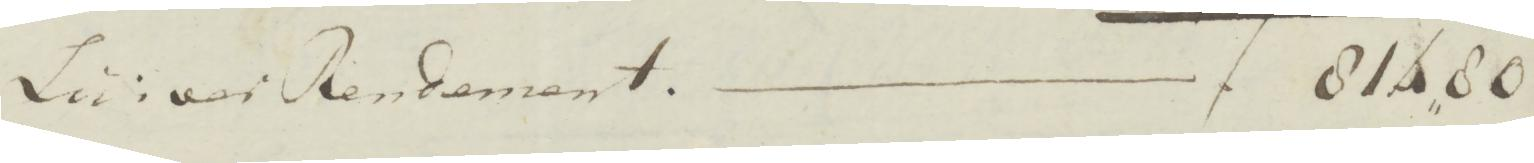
Zuiver Rendement. — ƒ 814„80
